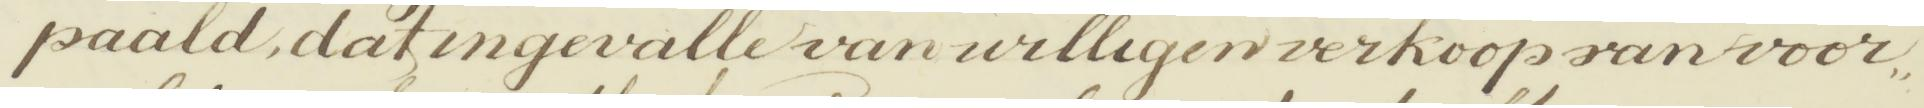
paald, dat ingevalle van willigen verkoop van voor„
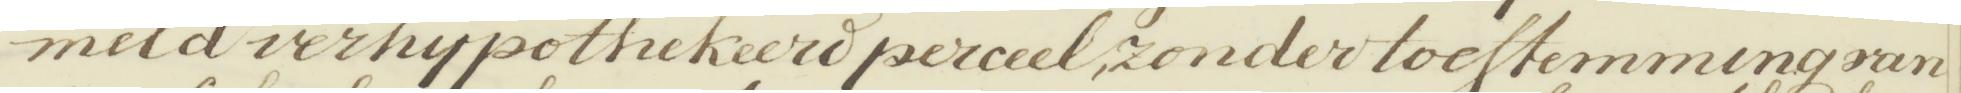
meld verhypothekeerd perceel, zonder toestemming van
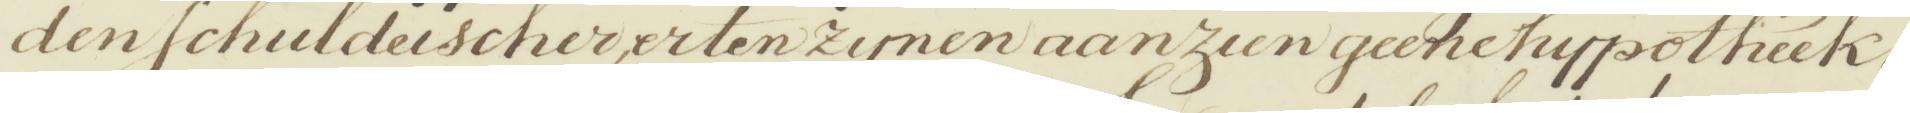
den Schuldeischer, er ten zynen aanzien geene hypotheek
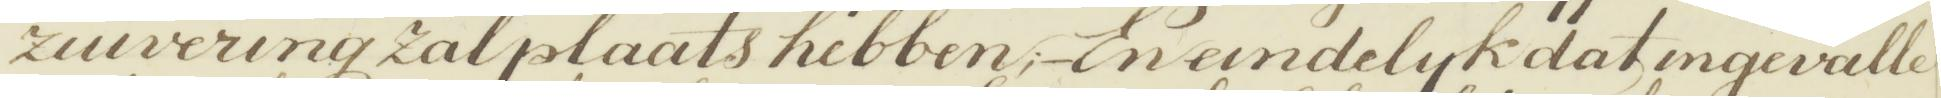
zuivering zal plaats hebben; - En eindelyk dat ingevalle
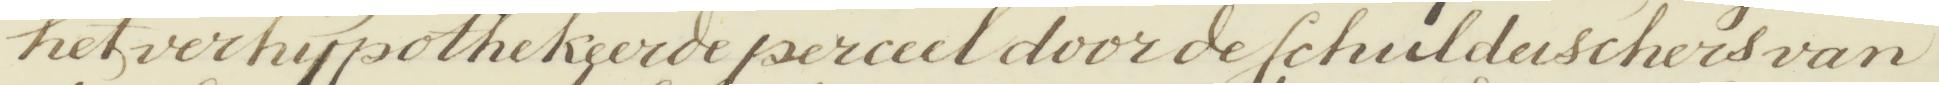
het verhypothekeerde perceel door de Schuldeischers van
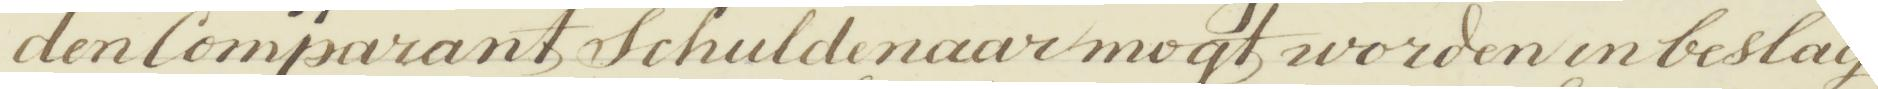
den Comparant Schuldenaar mogt worden in beslag
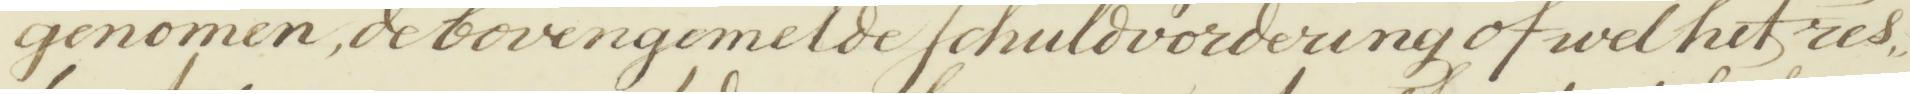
genomen, de bovengemelde Schuldvordering of wel het res„
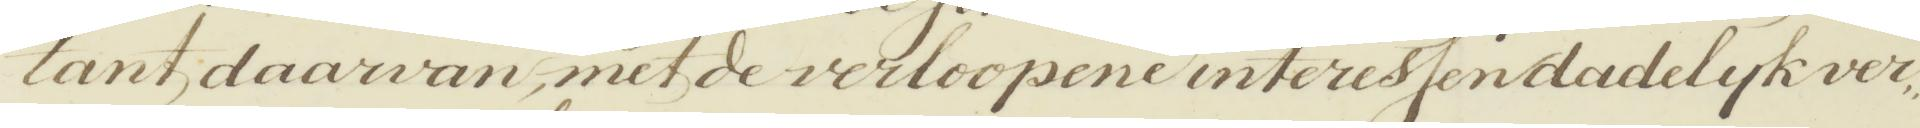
tant daarvan, met de verloopene interessen dadelyk ver„
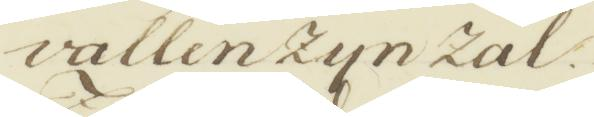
vallen zyn zal.
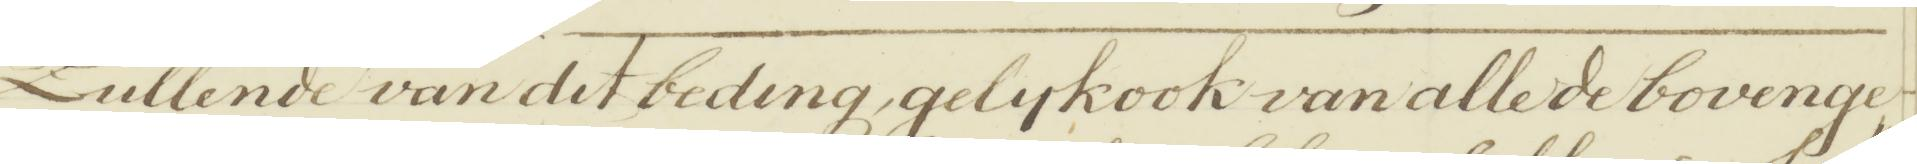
Zullende van dit beding, gelyk ook van alle de bovenge
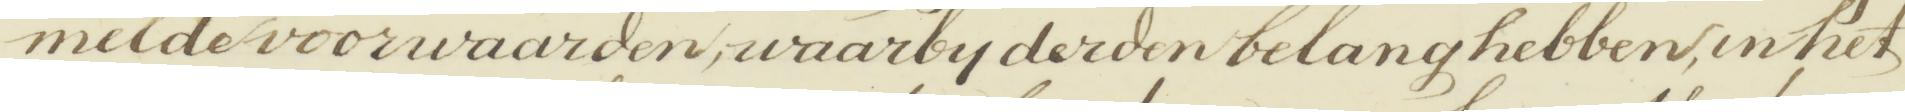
melde voorwaarden, waarby derden belang hebben, in het
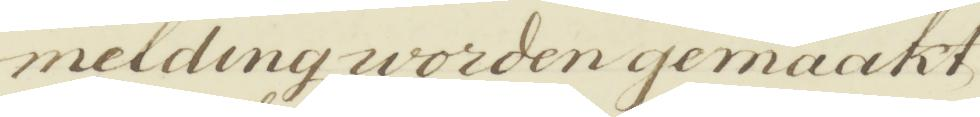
melding worden gemaakt
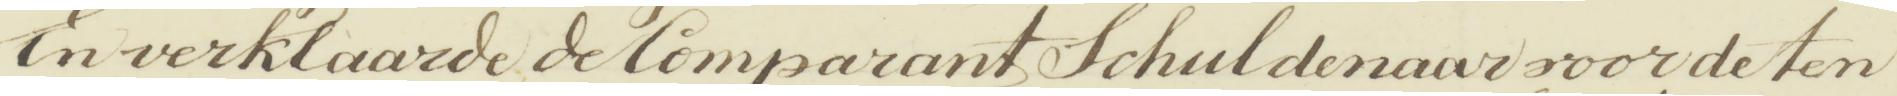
En verklaarde de Comparant Schuldenaar voor de ten
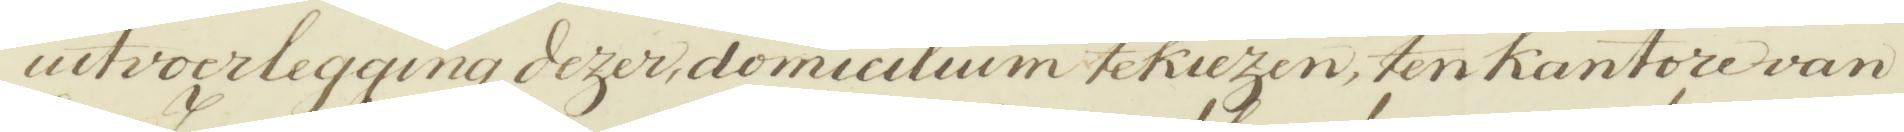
uitvoerlegging dezer, domicilium te kiezen, ten kantore van
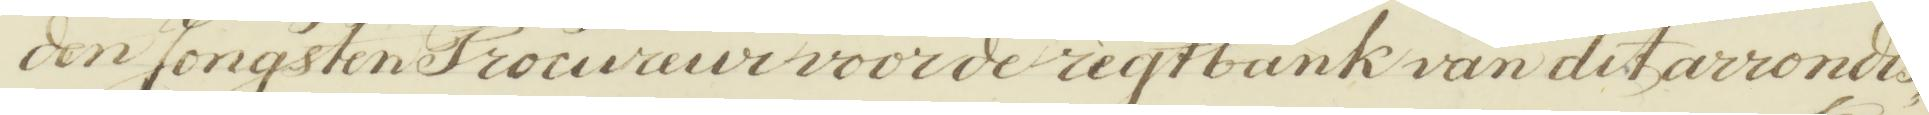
den Jongsten Procureur voor de regtbank van dit arrondis
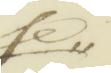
se=
